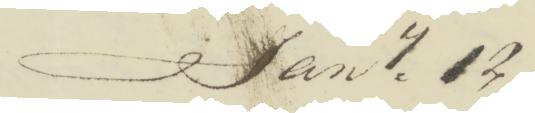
Jan.y 12
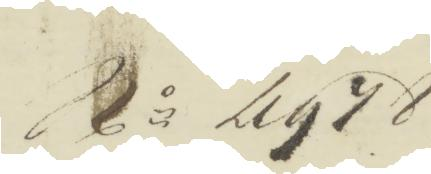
N=o 4978
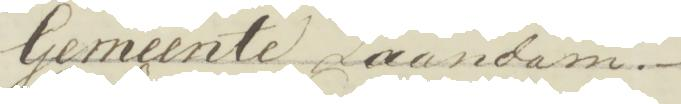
Gemeente Zaandam. -
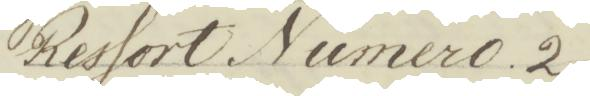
Ressort Numero. 2
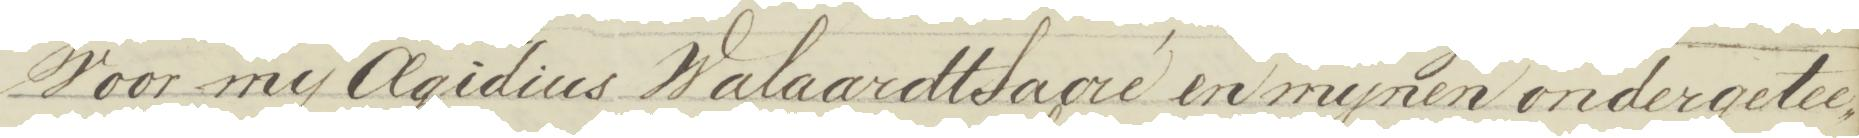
Voor my AEgidius Walaardt Sacré en mynen ondergetee
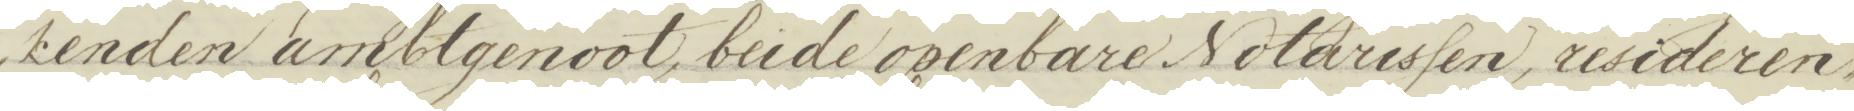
kenden ambtgenoot, beide openbare Notarissen, resideren
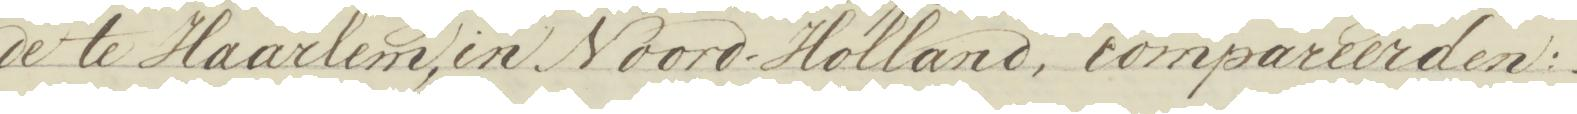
de te Haarlem, in Noord-Holland, compareerden:
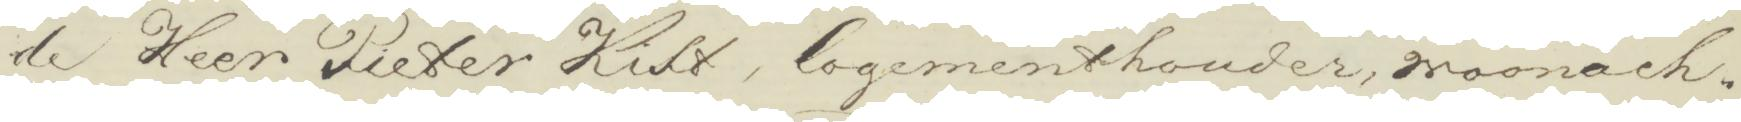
de Heer Pieter Kist, logementhouder, woonach
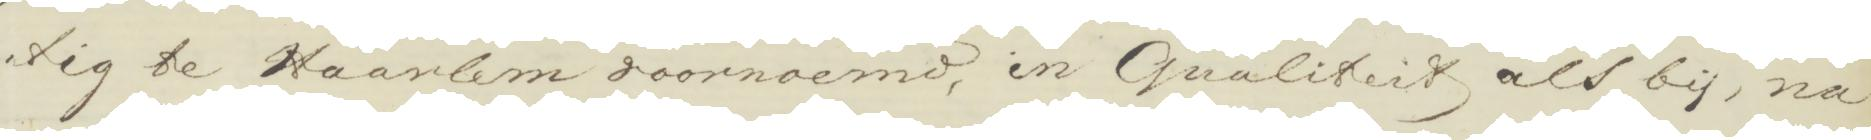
tig te Haarlem voornoemd, in qualiteit als bij, na
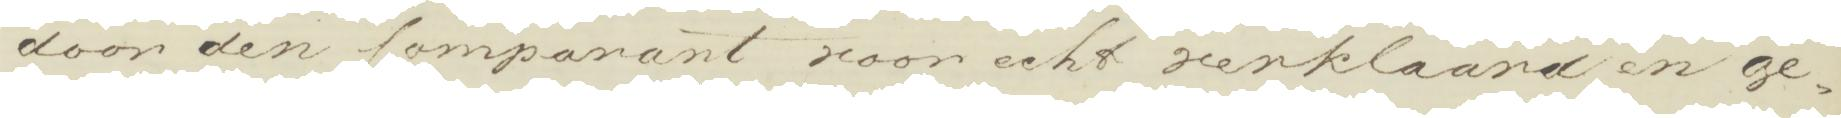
door den Comparant voor echt verklaard en ge„
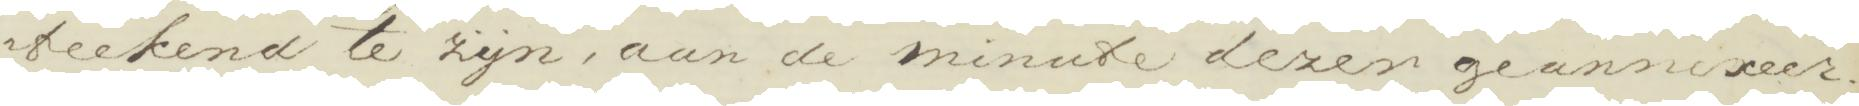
teekend te zijn, aan de minute dezer geannexeer
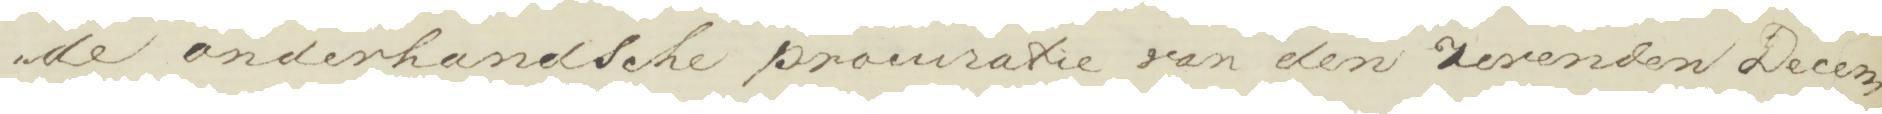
de onderhandsche procuratie van den zevenden Decem
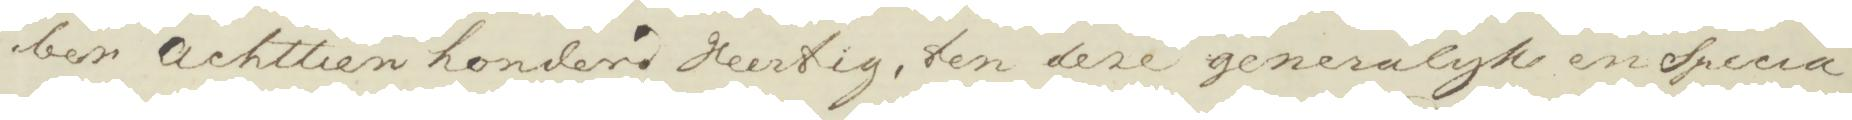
,ber Achttien honderd Veertig, ten deze generalyk en specia
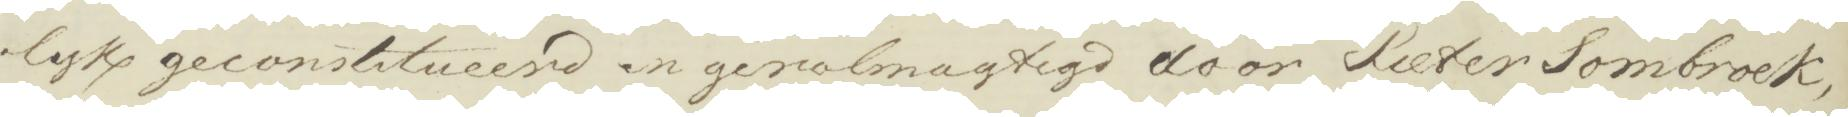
lyk geconstitueerd en gevolmagtigd door Pieter Sombroek,
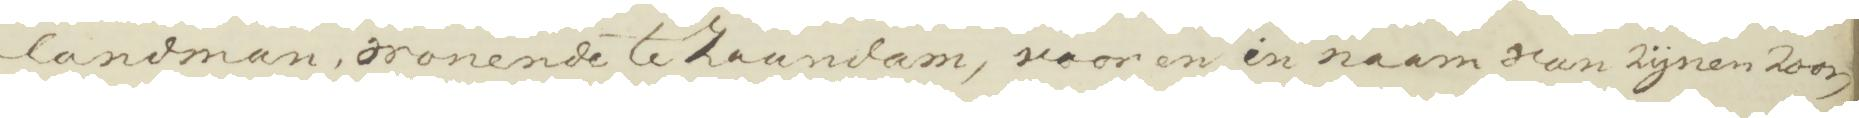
landman, wonende te Zaandam, voor en in naam van zijnen zoon
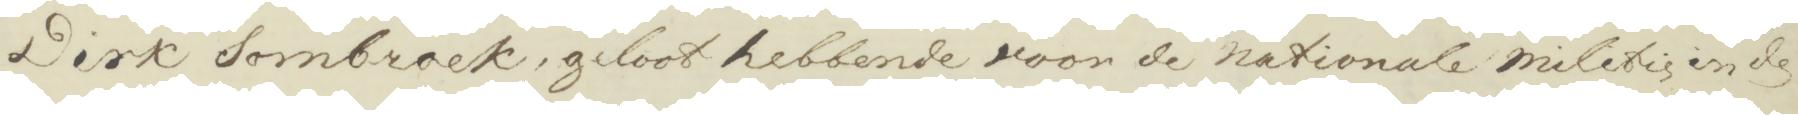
Dirk Sombroek, geloot hebbende voor de nationale militie in de
